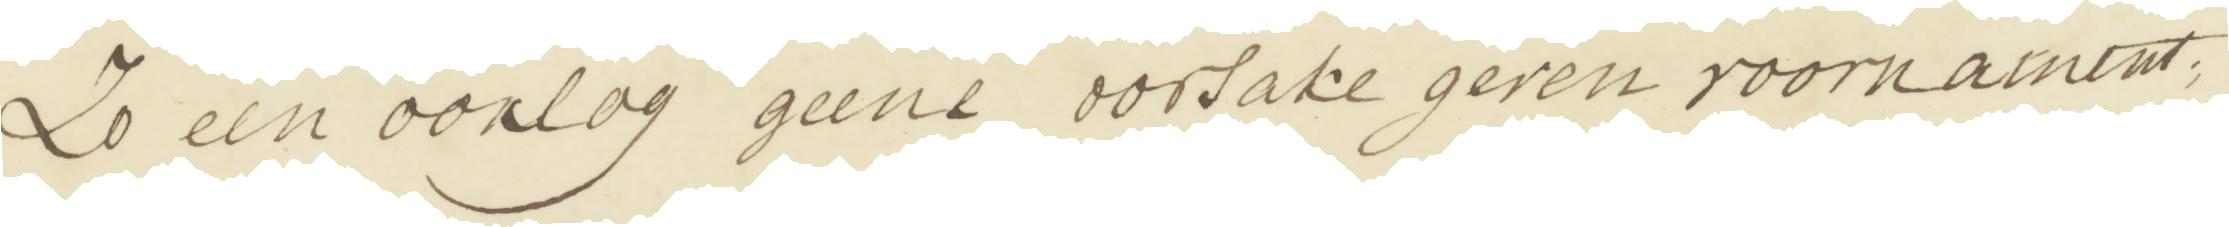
zo een oorlog geene oorsake geven voornament„
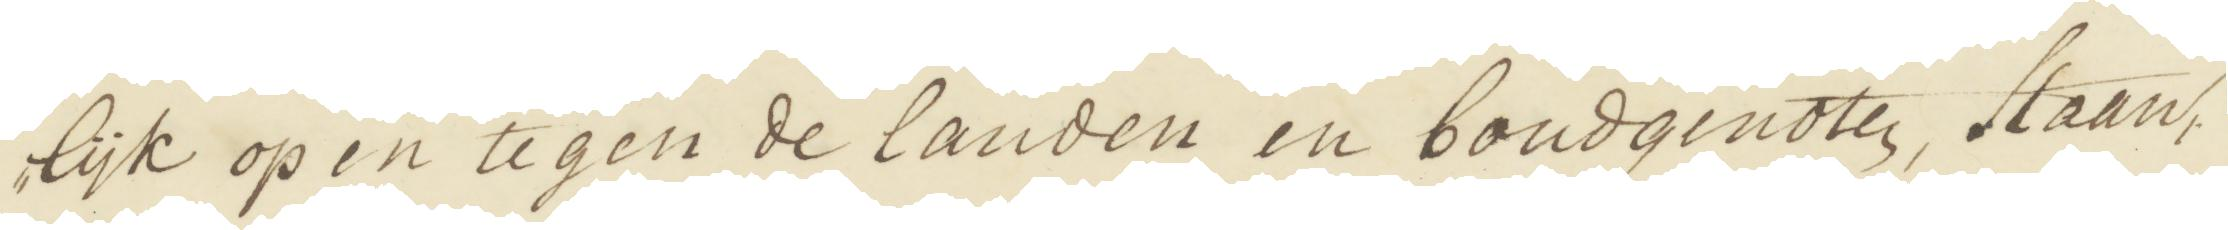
„lijk op en tegen de landen en bondgenoten, staan„
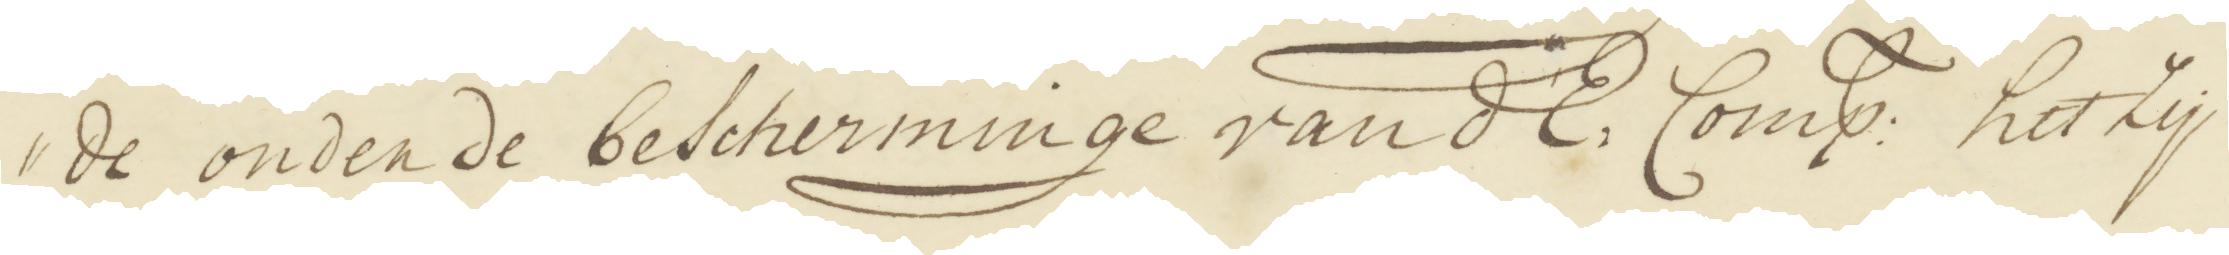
„de onder de bescherminge van d'E: Comp: het zij
